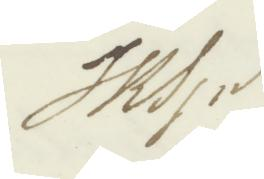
IKSjr
